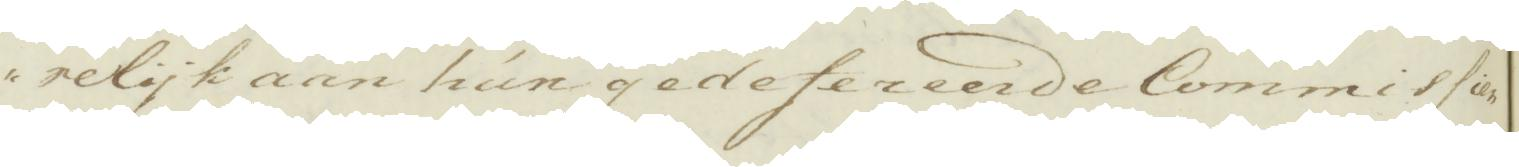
„velijk aan hun gedefereerde Commissien
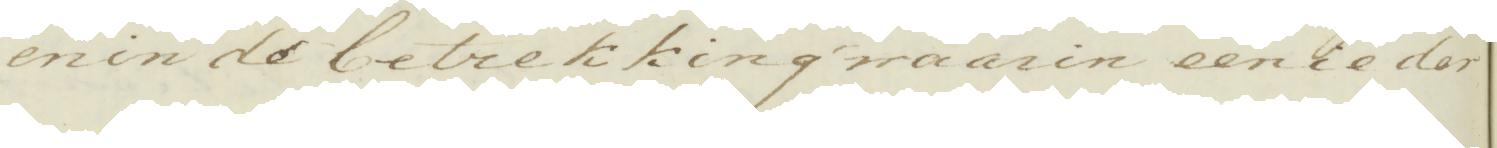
en in de betrekking waarin een ieder
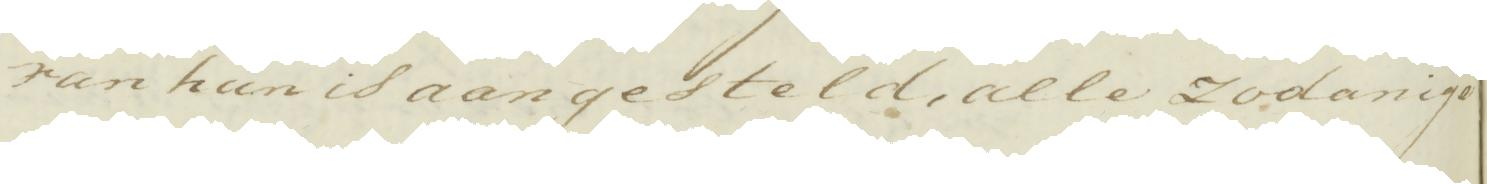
van hun is aangesteld, alle zodanige
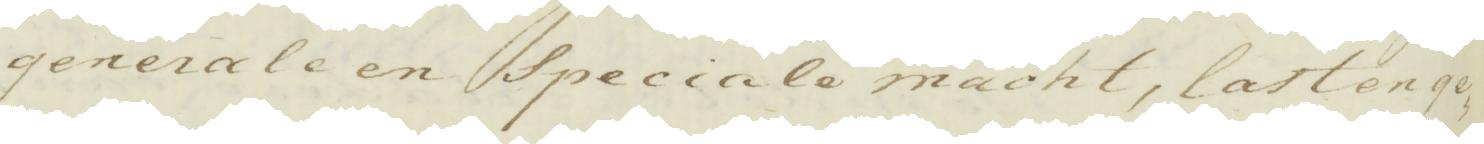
generale en speciale macht, last en ge„
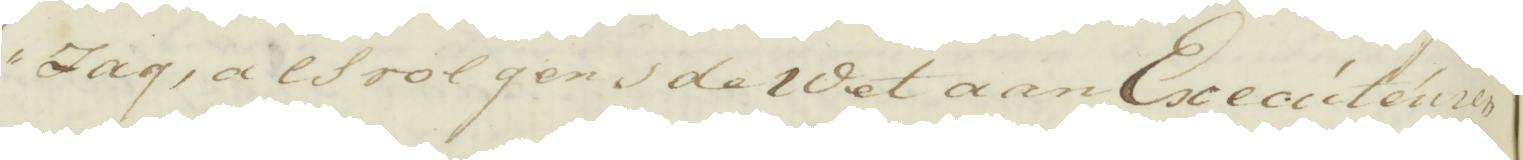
„zag, als volgens de Wet aan Executeuren
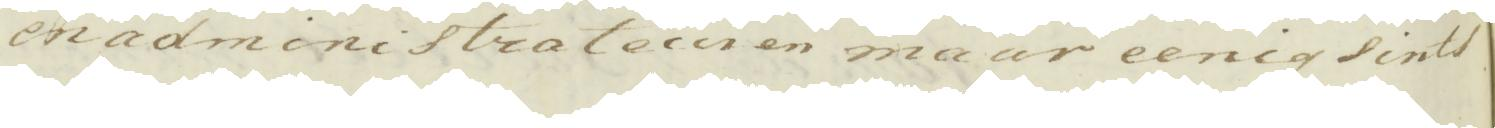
en administrateuren maar eenig sints
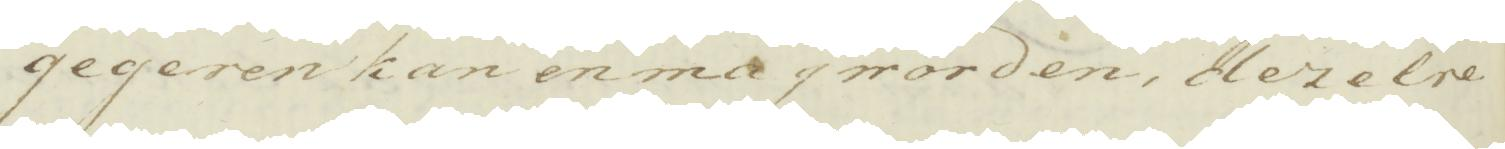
gegeven kan en mag worden, dezelve
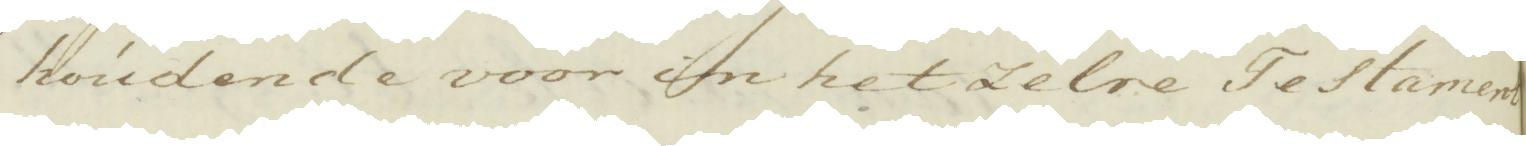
houdende voor in het zelve Testament
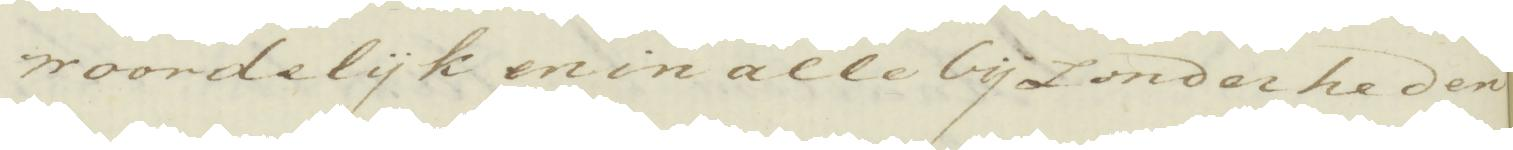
woordelijk en in alle bijzonderheden
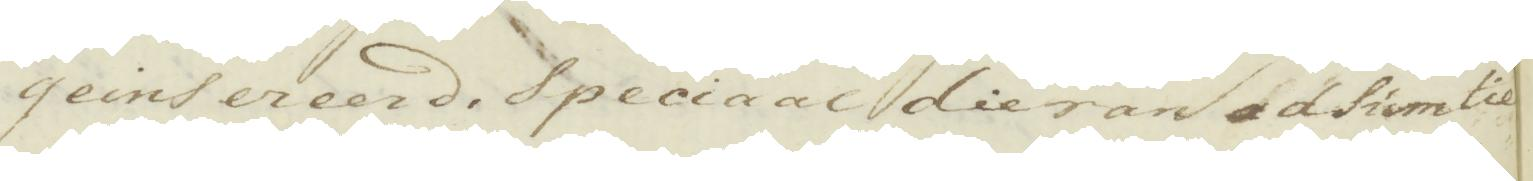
geinsereerd, speciaal die van adsumtie
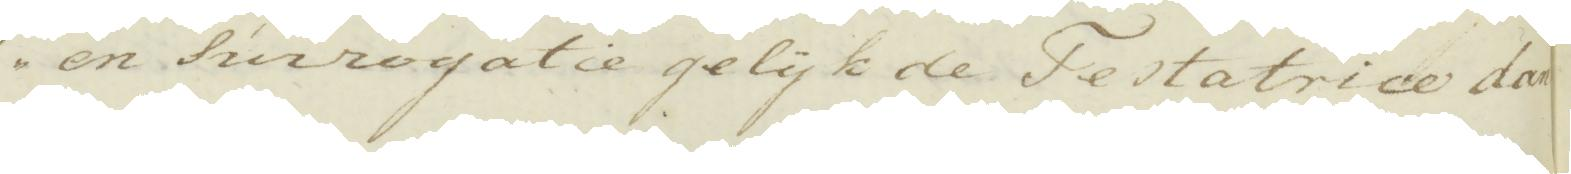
„en surrogatie gelijk de Testatrice dan
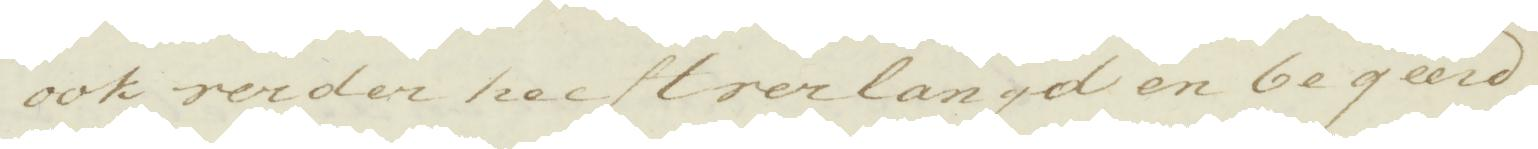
ook verder heeft verlangd en begeerd
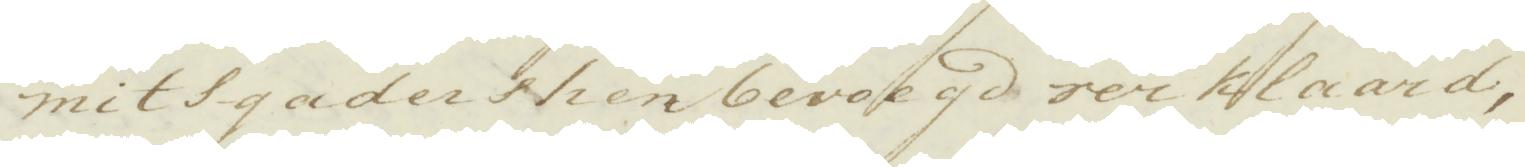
mitsgaders hen bevoegd verklaard,
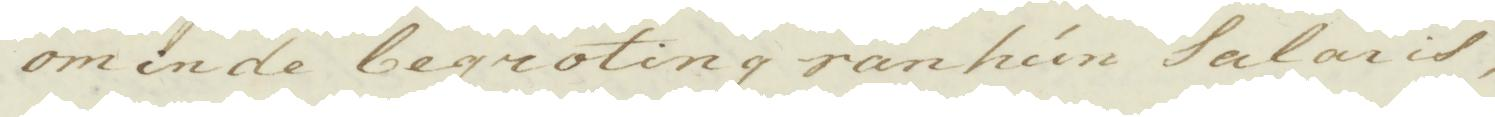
om in de begroting van hun Salaris,
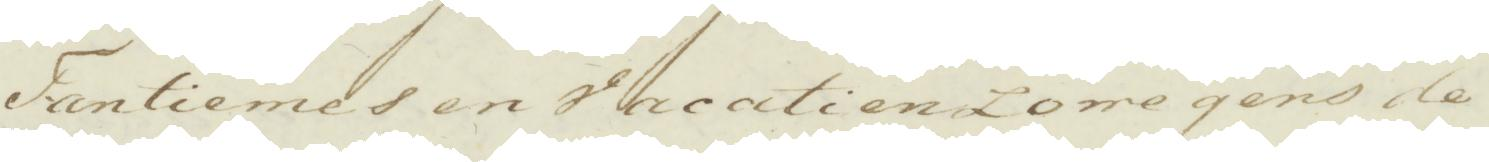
Tantiemes en Vacatien zo wegens de
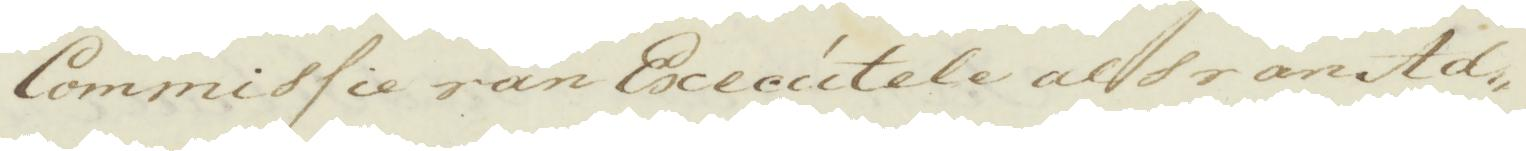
Commissie van Executele als van Ad„
